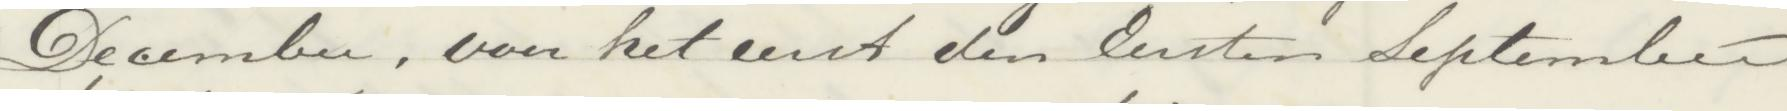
December, voor het eerst den Eersten september
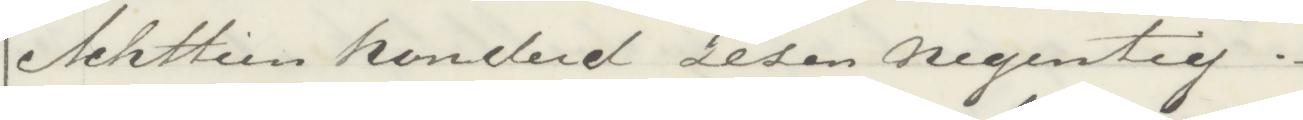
Achttien honderd zesen negentig.
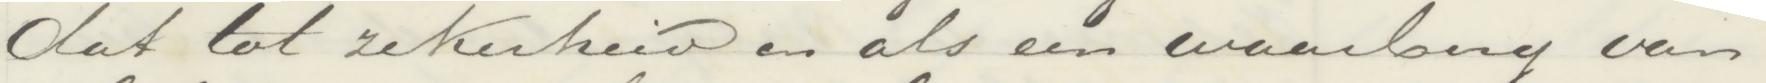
dat tot zekerheid en als een waarborg van
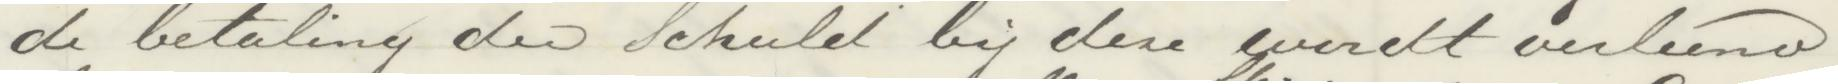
de betaling der schuld bij deze wordt verleend
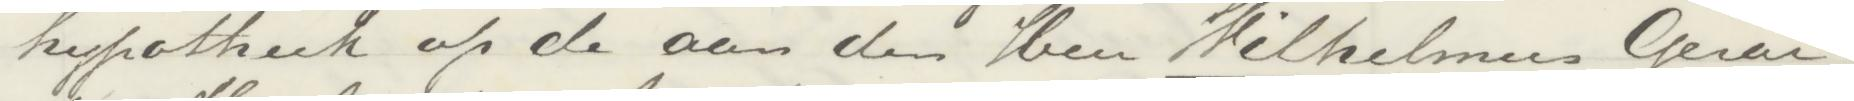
hypotheek op de aan den Heer Wilhelmus Gerar
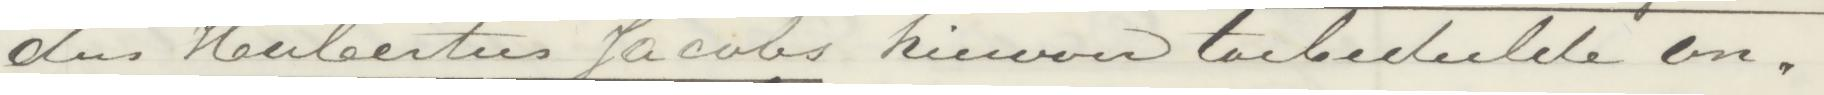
dus Hubertus Jacobs hiervoor toebedeelde on„
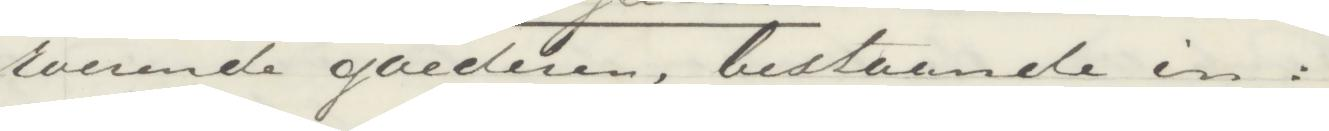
roerende goederen, bestaande in:
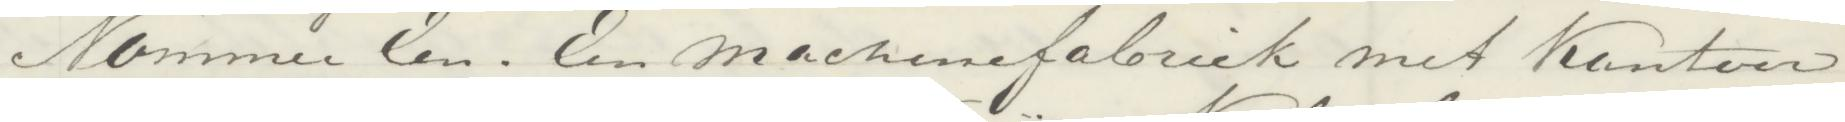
Nommer Een. Een machinefabriek met kantoor,
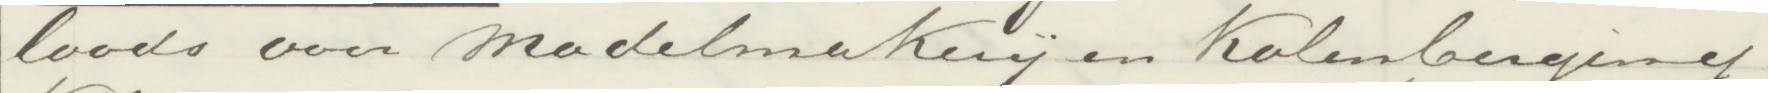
loods voor modelmakerij en kolenberging
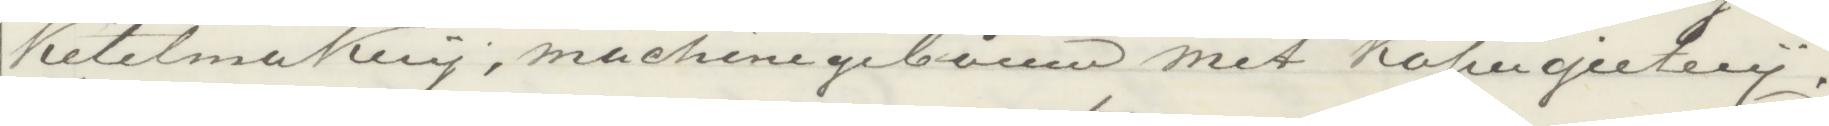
ketelmakerij, machinegebouw met kopergieterij,
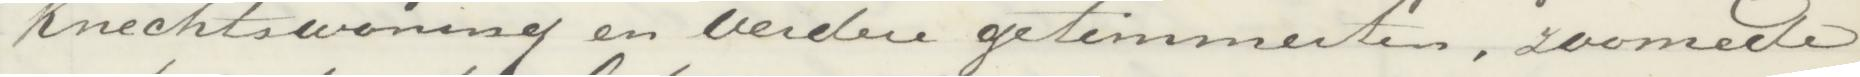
knechtswoning en verdere getimmerten, zoomede
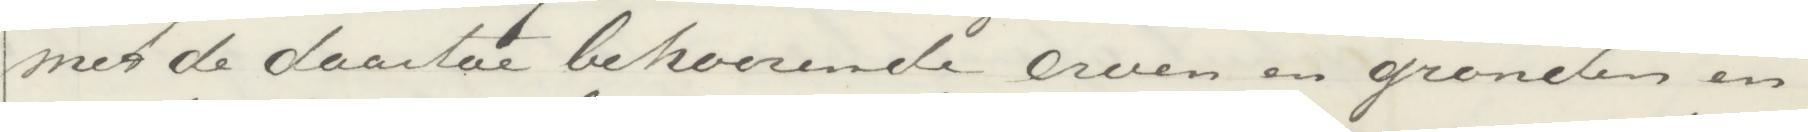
met de daartoe behoorende erven en gronden en
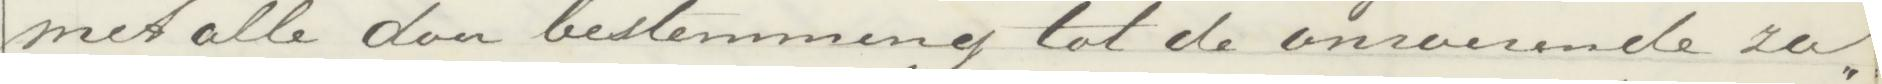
met alle door bestemming tot de onroerende za„
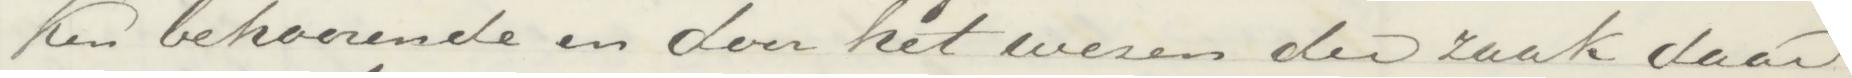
ken behoorende en door het wezen der zaak daar
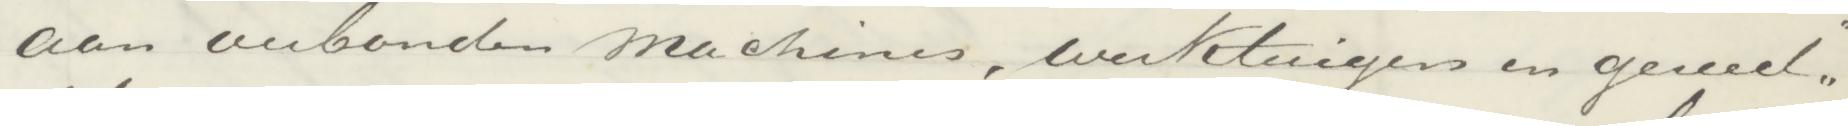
aan verbonden machines, werktuigen en gereed„
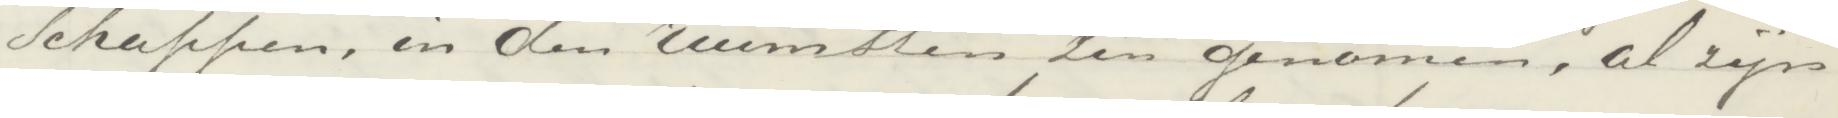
schappen, in den ruimsten zin genomen, al zijn
